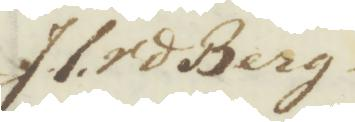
J.C. vd Berg
